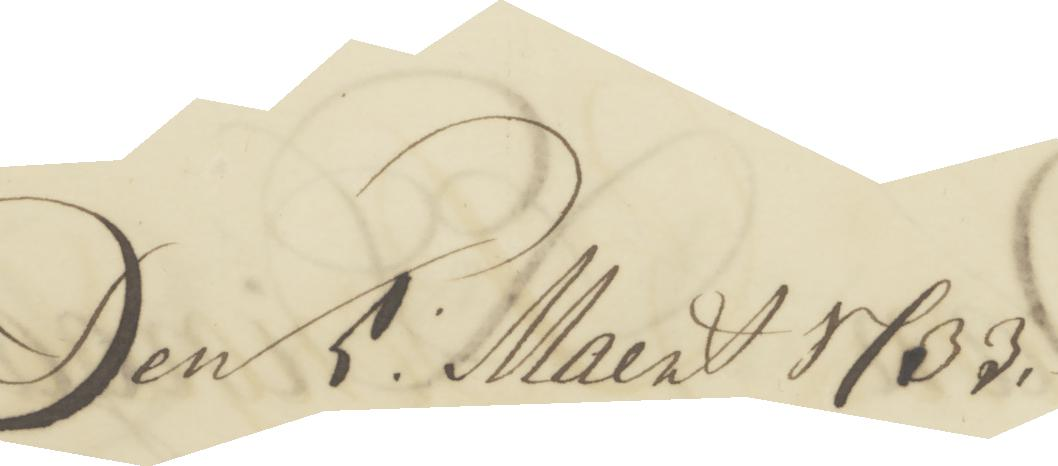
Van Bengale Den 5:' Maert 1733:
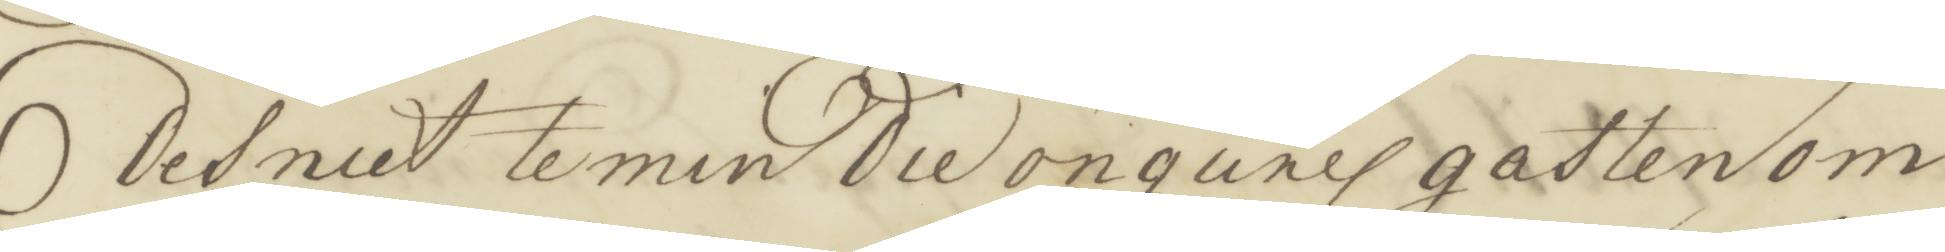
des niet te min die ongure gasten om
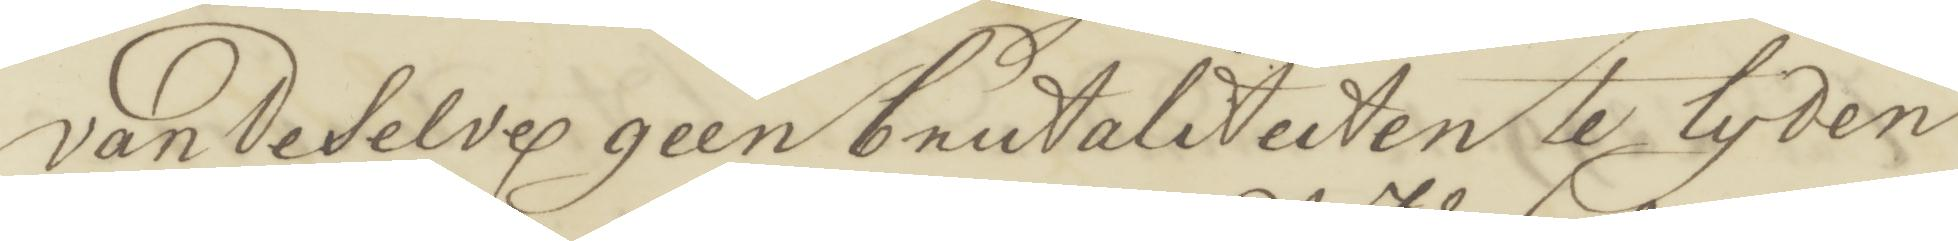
van deselve geen brutaliteiten te lyden
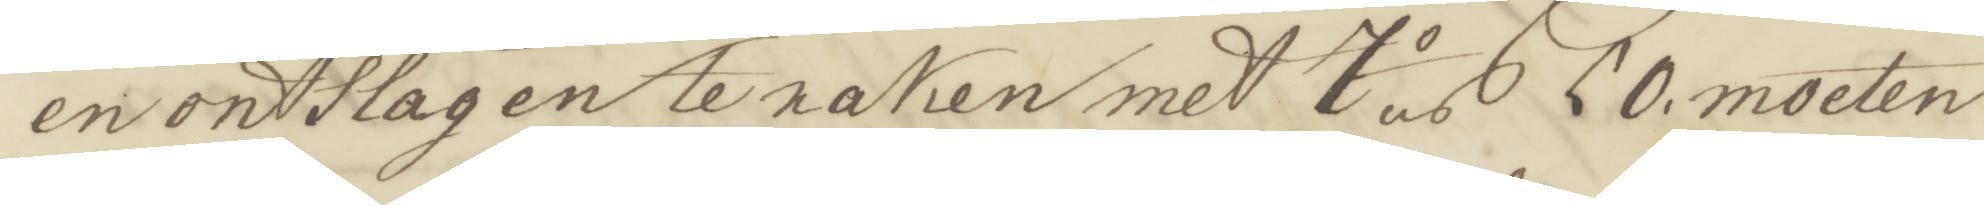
en ontslagen te raken met R:o/as 50. moeten
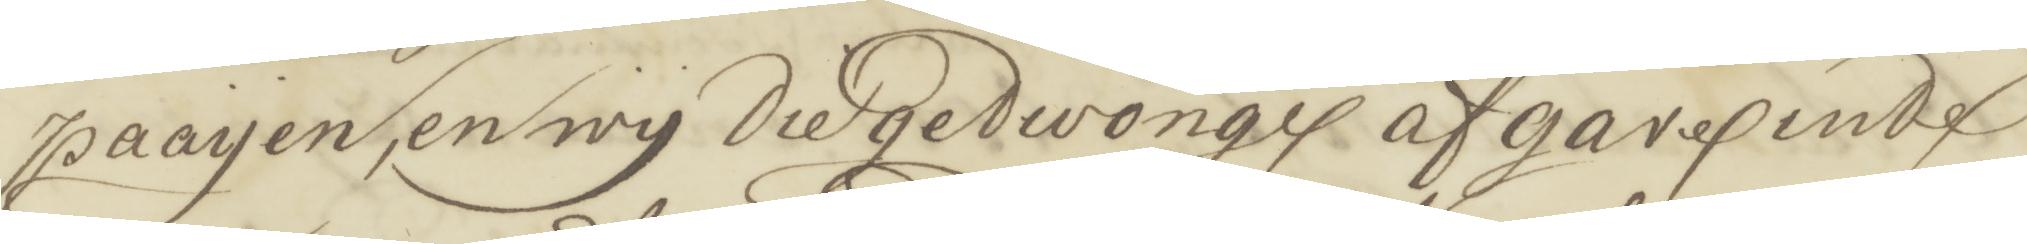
paaijen, en wij die gedwonge afgave inde
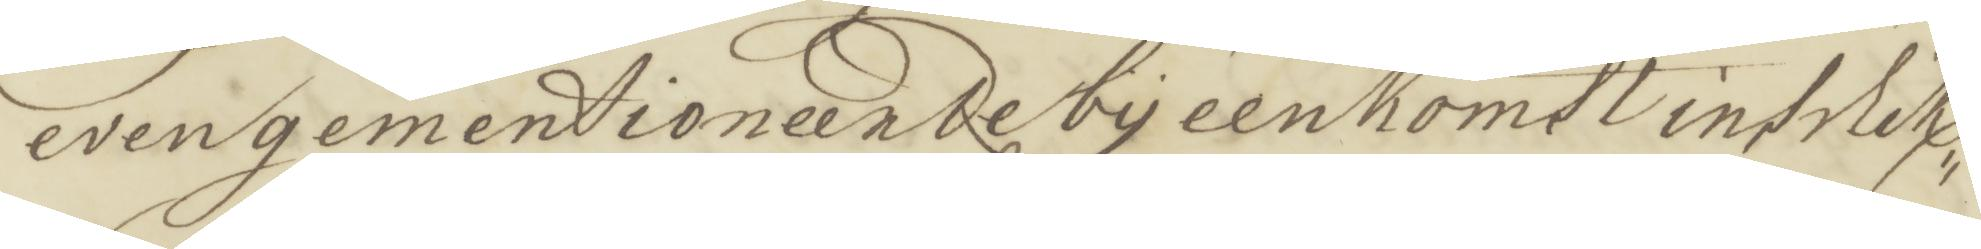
even gementioneerde bij eenkomst inschik„
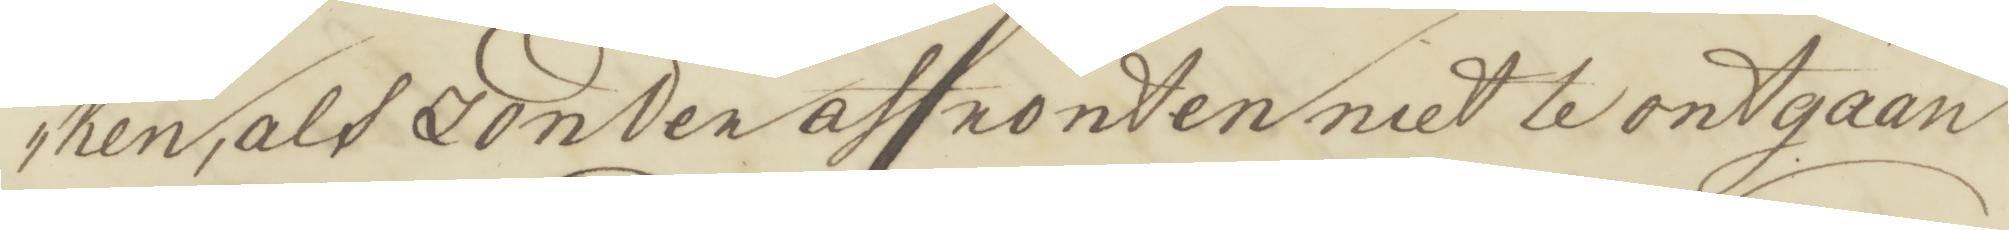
ken, als zonder affronten niet te ontgaan
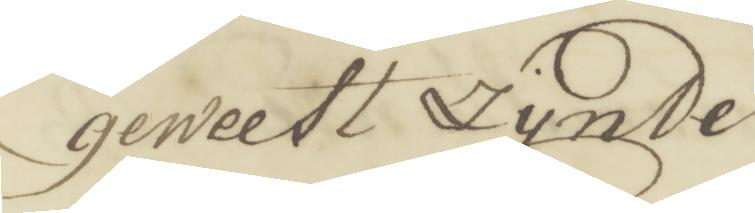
geweest zijnde
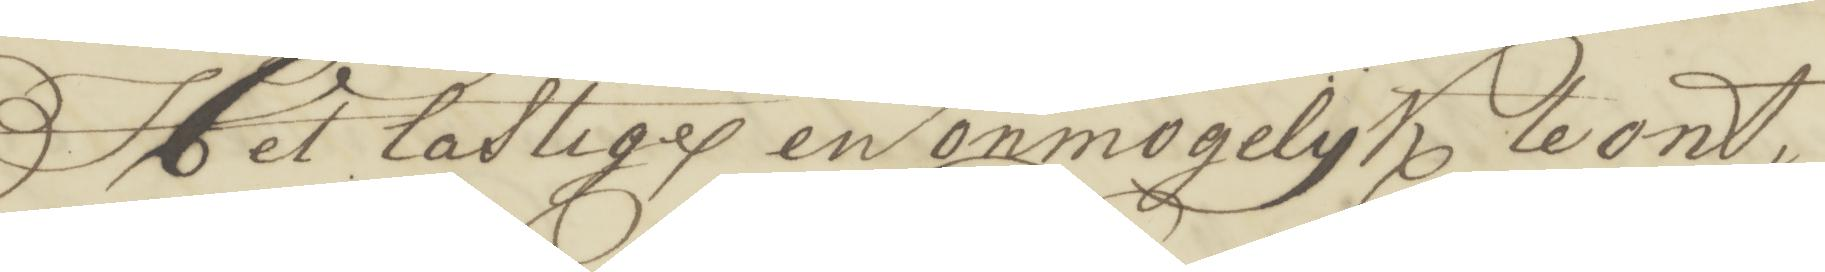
Het lastige en onmogelijk te ont„
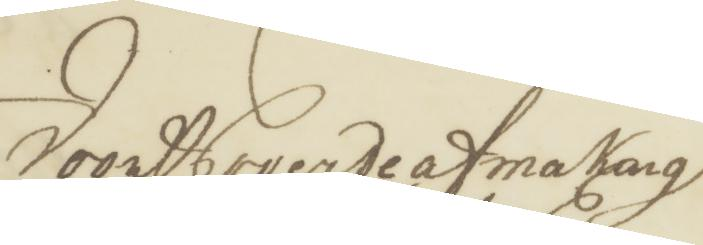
voorts over de afmaking
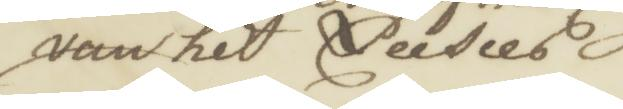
van het Peesces
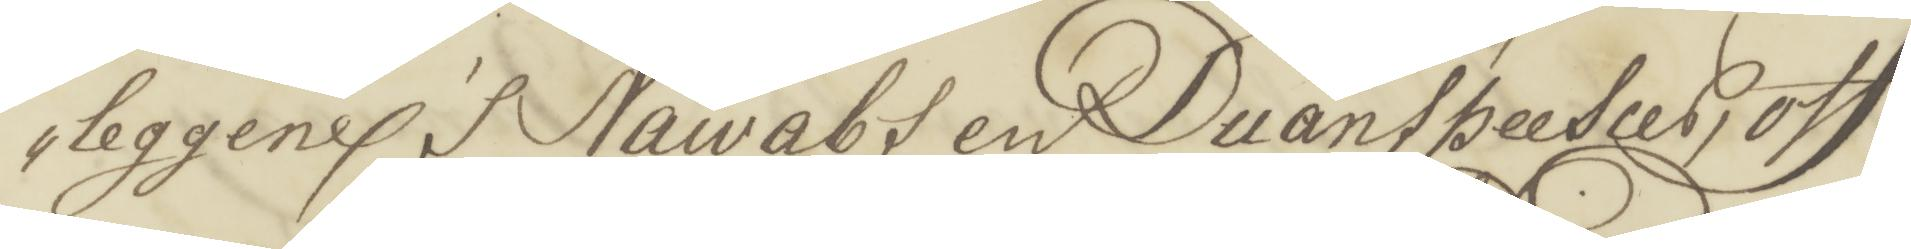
„leggen 'S Nawabs en Duans peesces, off
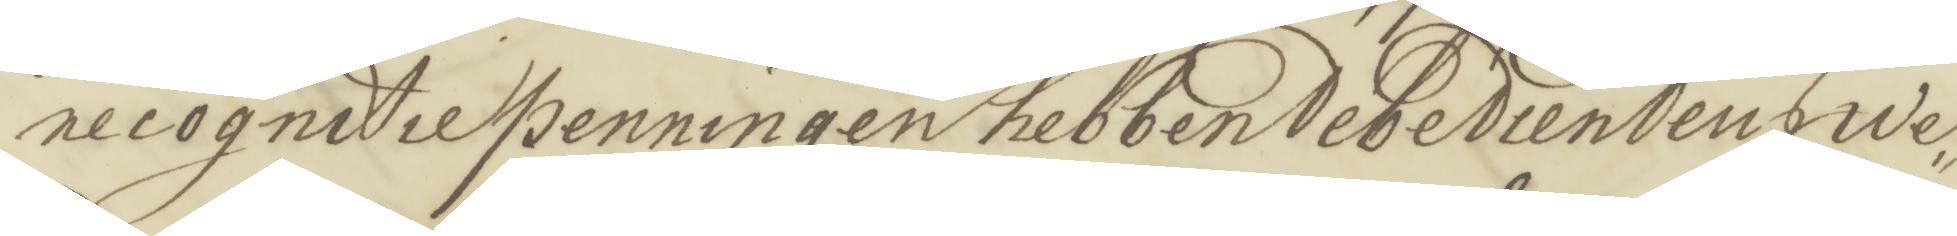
recognitiepenningen hebben de bediendens we„
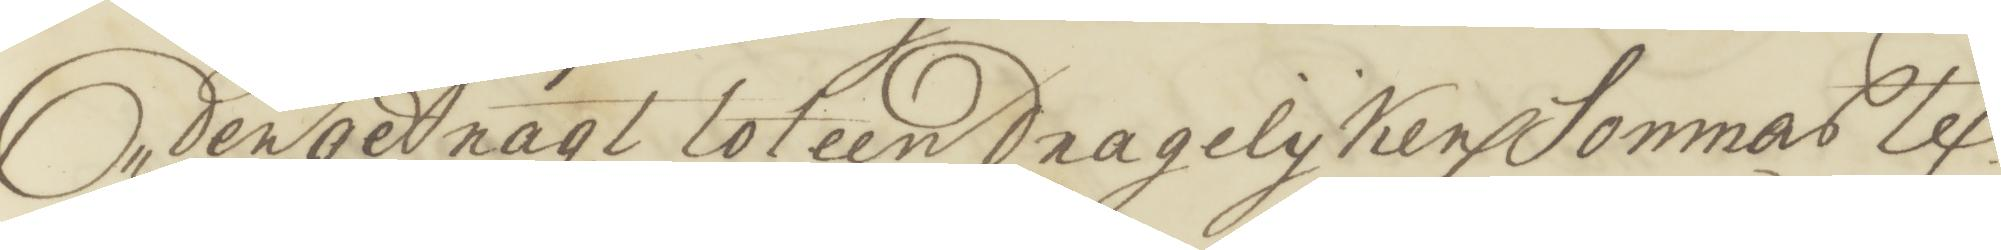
„der gebragt tot een dragelijker Sommas te
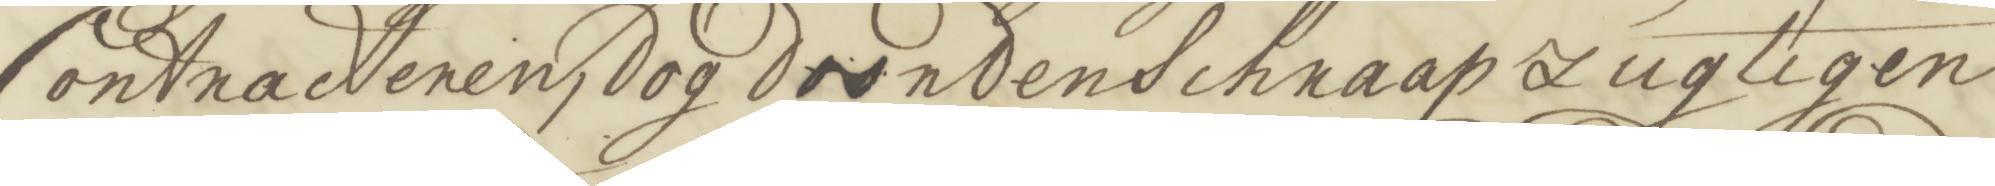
Contracteren, dog door den Schraapzugtigen
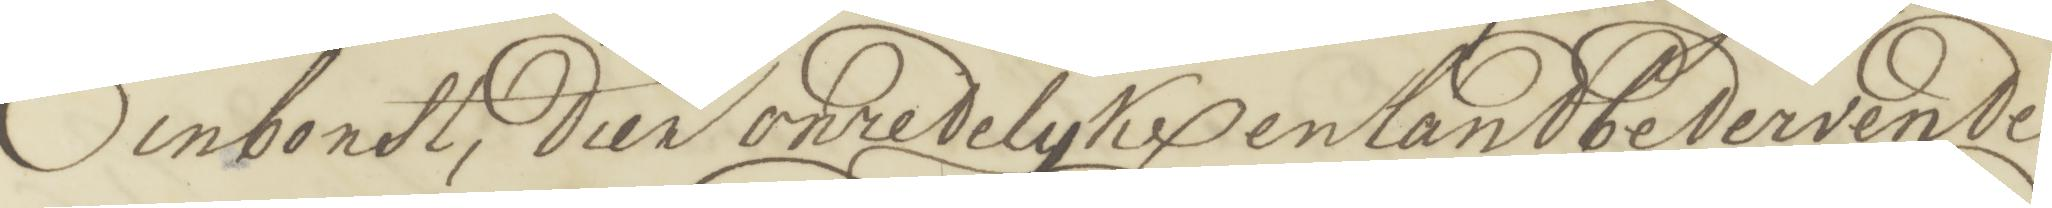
inborst, dier onredelyke en landbedervende
